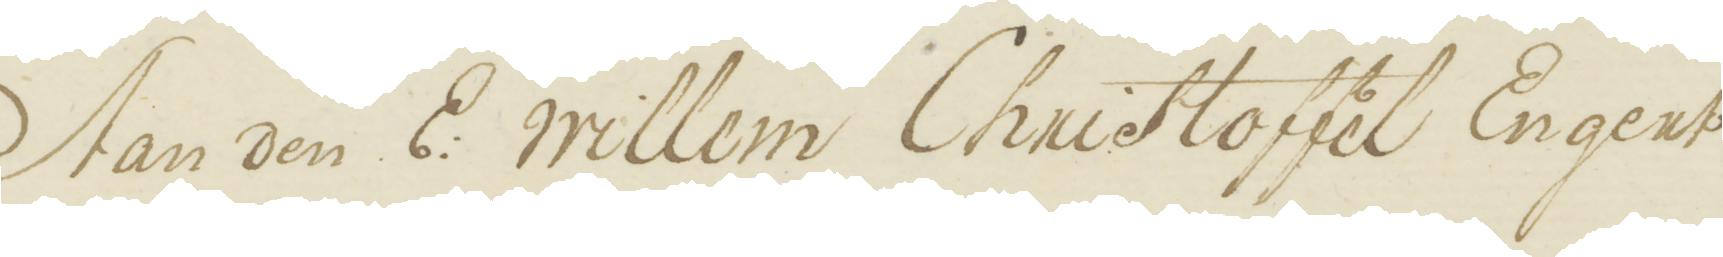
Aan den E: Willem Christoffel Engert
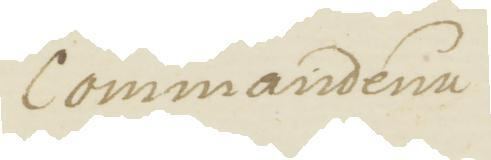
Commandeur
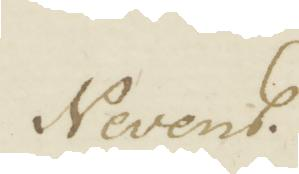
Nevens.
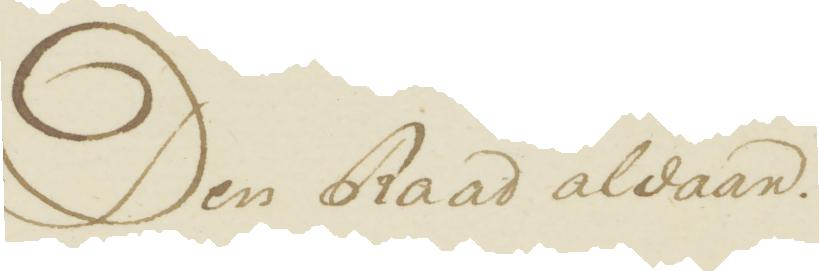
Den Raad aldaar.
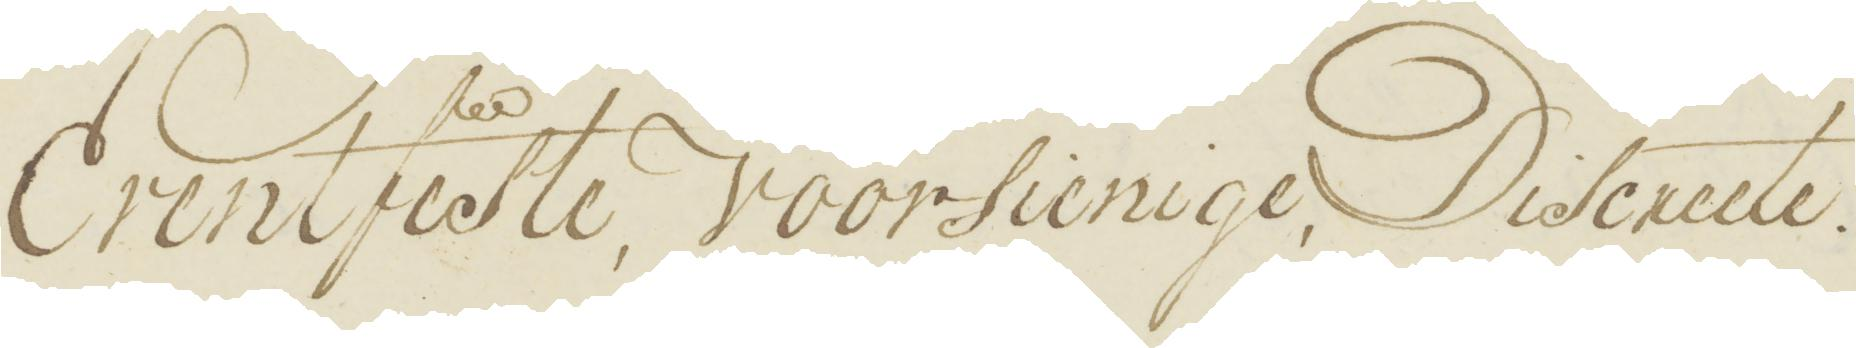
Eventfeste, Voorsienige, Discreete.
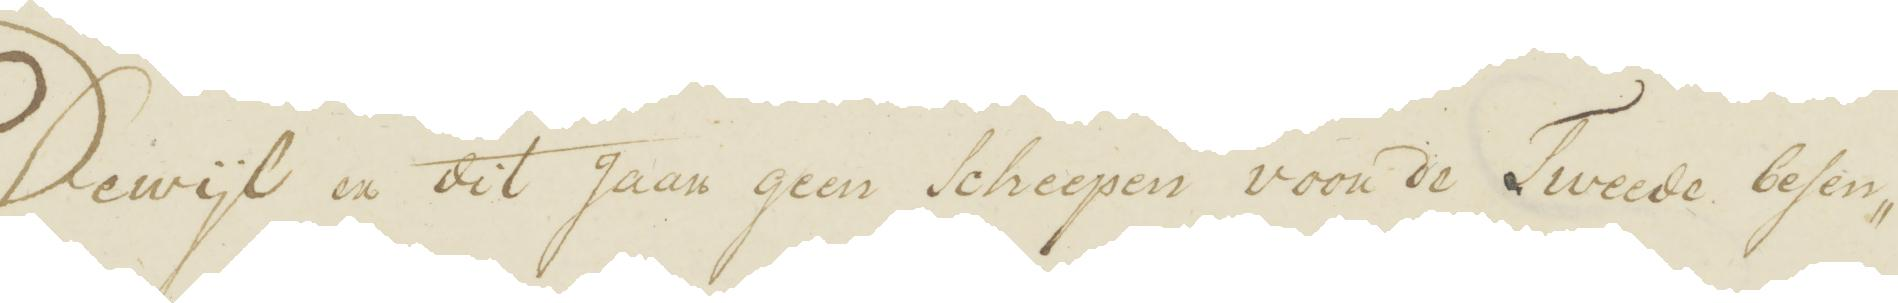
Dewijl er dit Jaar geen scheepen voor de Tweede besen„
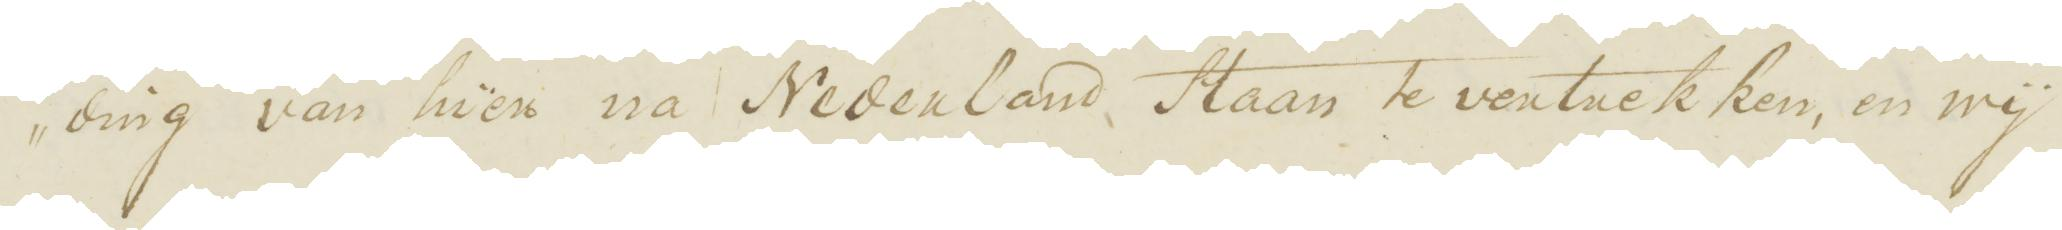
„ding van hier na Nederland staan te vertrekken, en wij
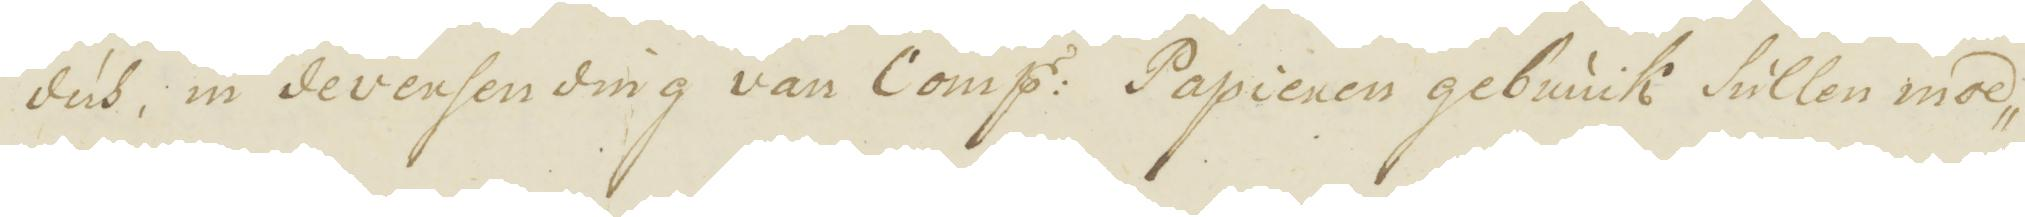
dus, in de versending van Comps: Papieren gebruik sullen moe„
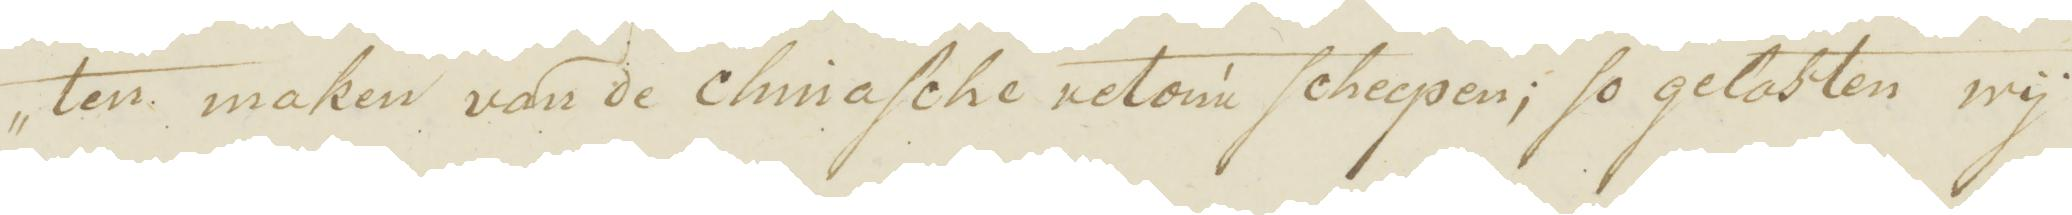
„ten maken van de chinasche retour scheepen; so gelasten wij
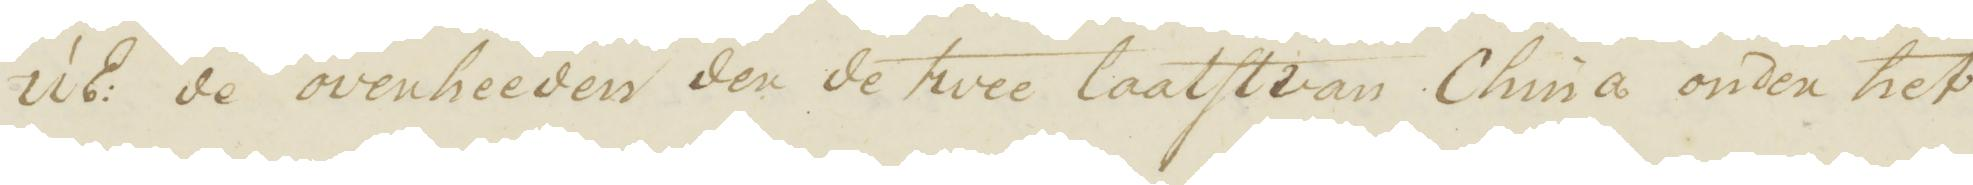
uE: de overheeden der de twee laatst van China onder het
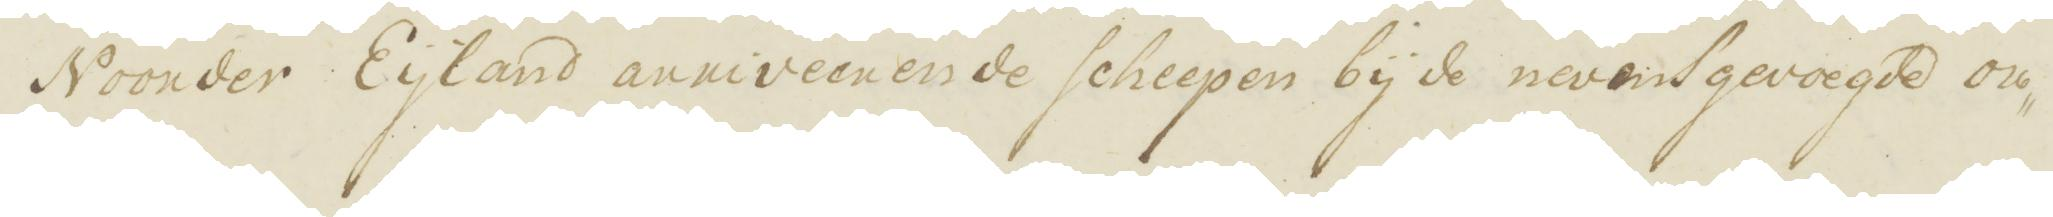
Noorder Eijland arriveerende scheepen bij de nevens gevoegde or„
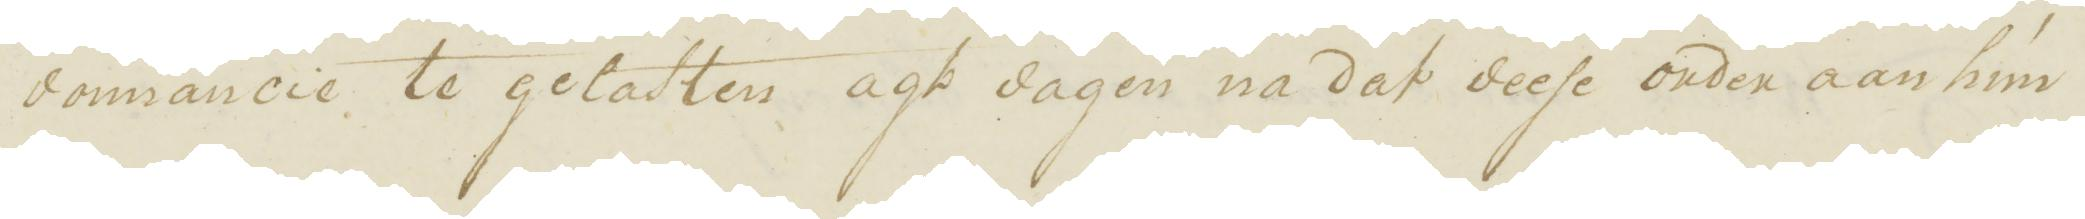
donnancie te gelasten agt dagen na dat deese order aan hun
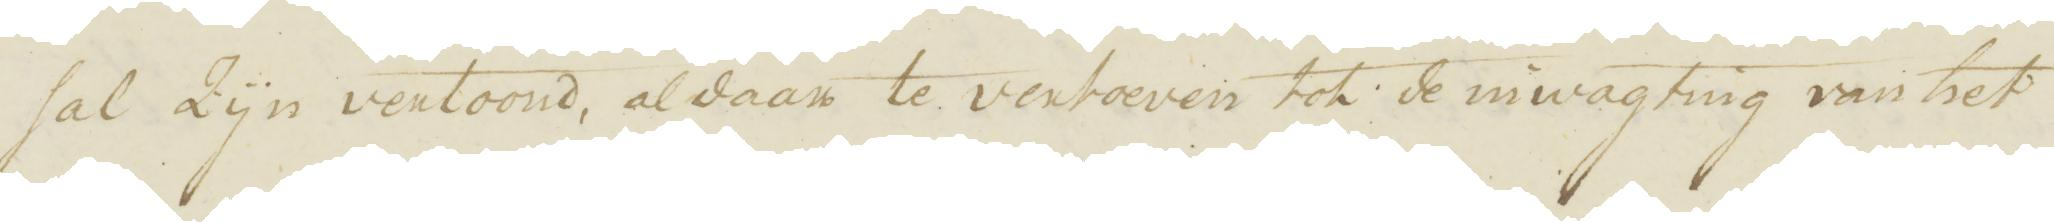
sal zijn vertoond, aldaar te vertoeven tot de inwagting van het
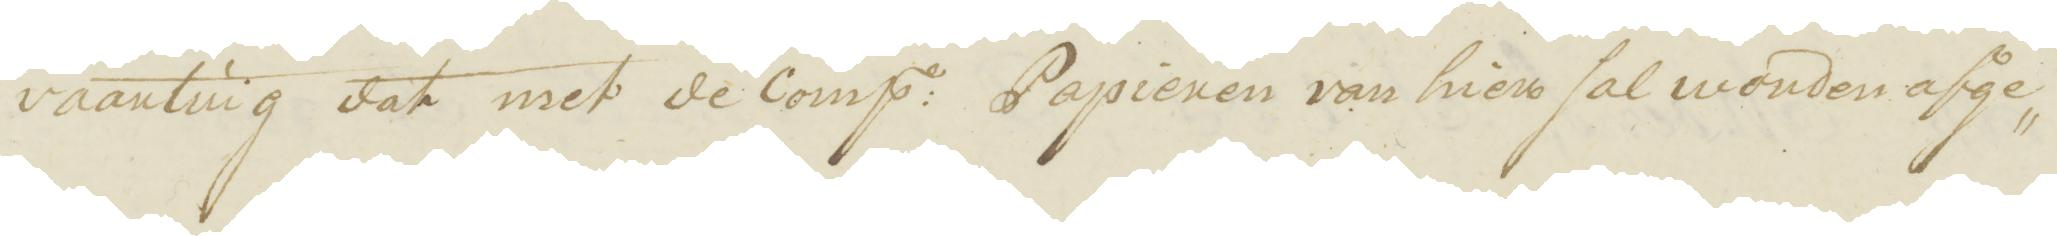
vaartuig dat met de Comp:e Papieren van hier sal worden afge„
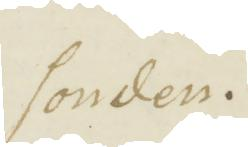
sonden.
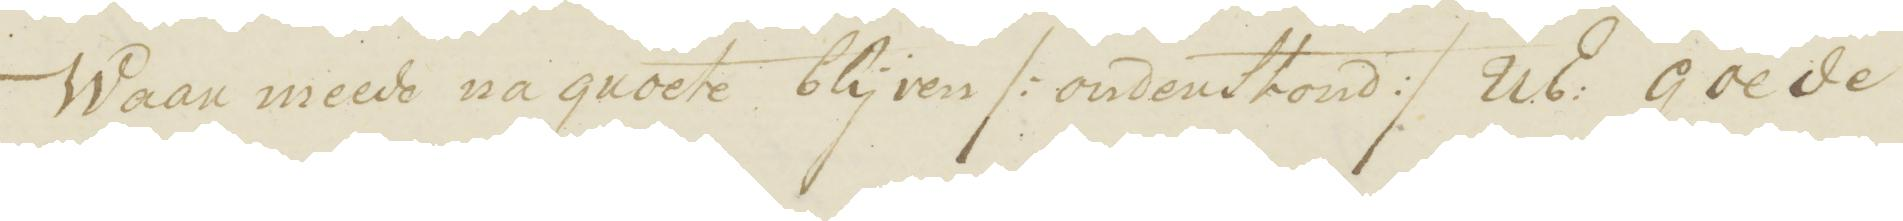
Waar meede na groete blijven /:onderstond:/ uE: goede
